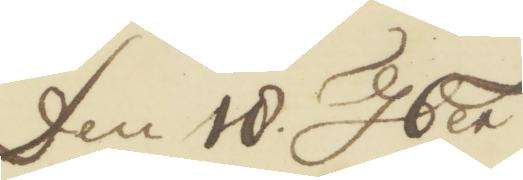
ten 18.' 7ber
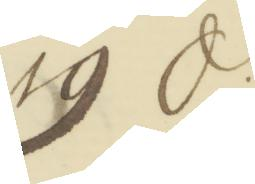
.„ . 19 d:o
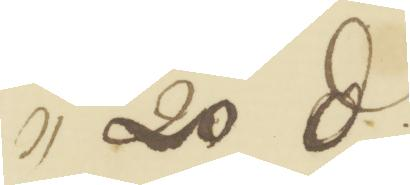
„ 20 d:o
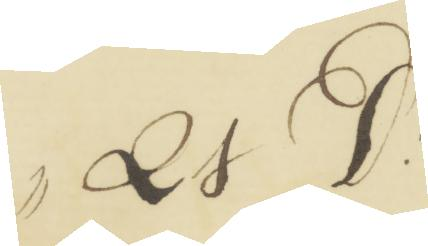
„ 21 D:o
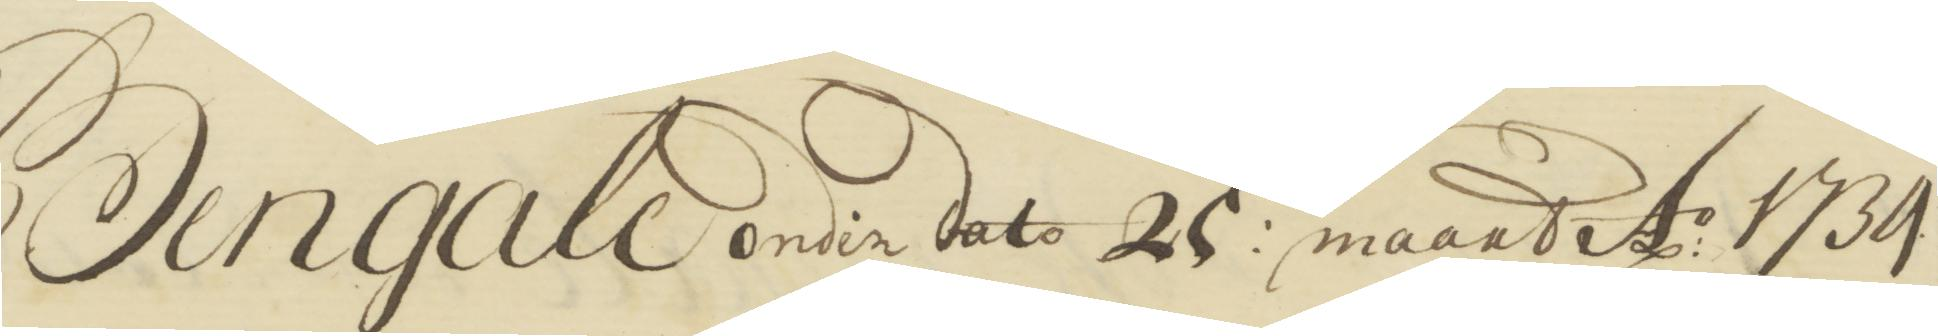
Van Bengale onder dato 25:' maart A:o 1734.
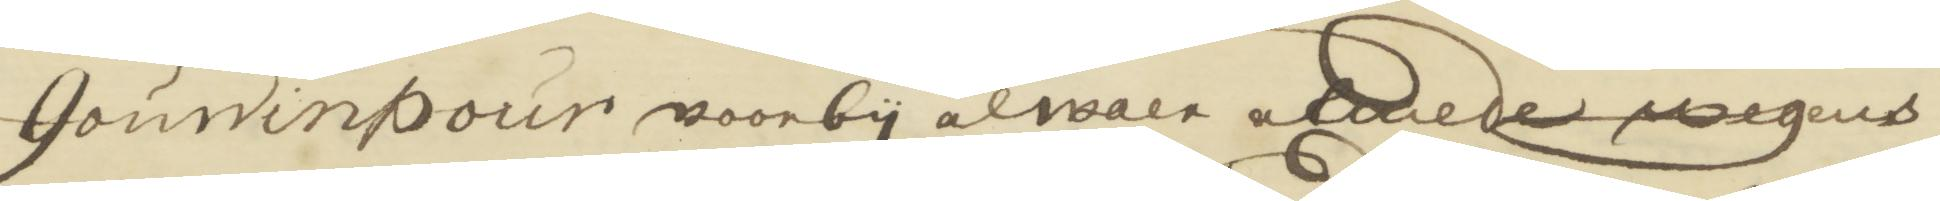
Gouwinpour voorbij alwaer almede wegens
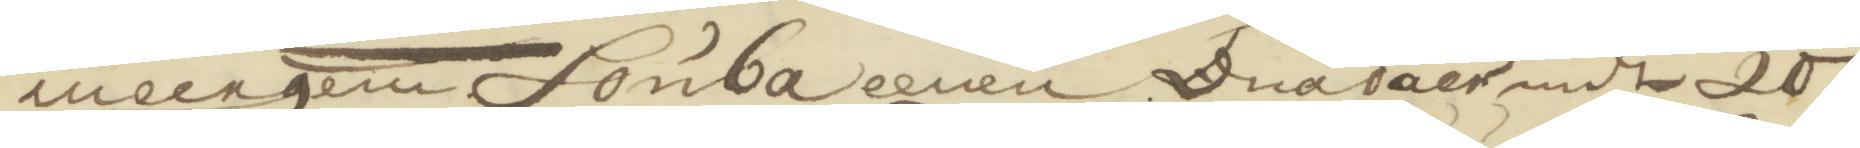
meergem Souba eenen Enadaer met 20.
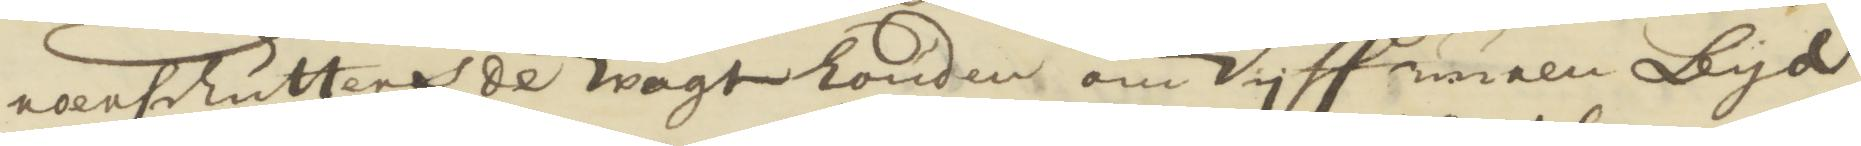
roerschutters de wagt houden om vijff uuren zeijde
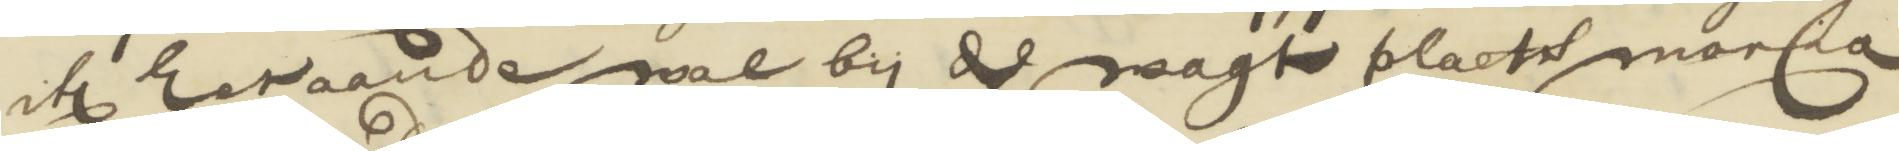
ik het aande wal bij de wagt plaets morcia
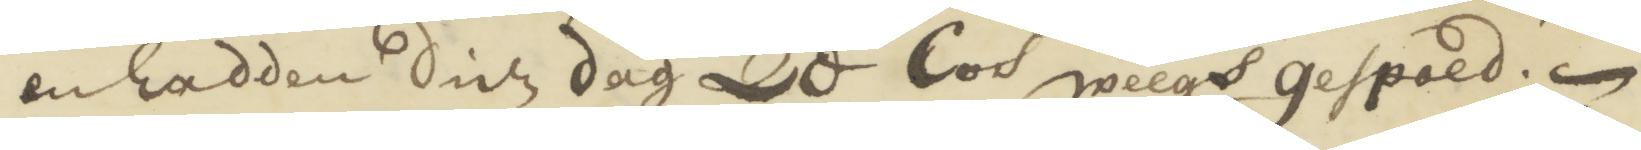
en hadden dien dag 20 Cos weegs gespoed.
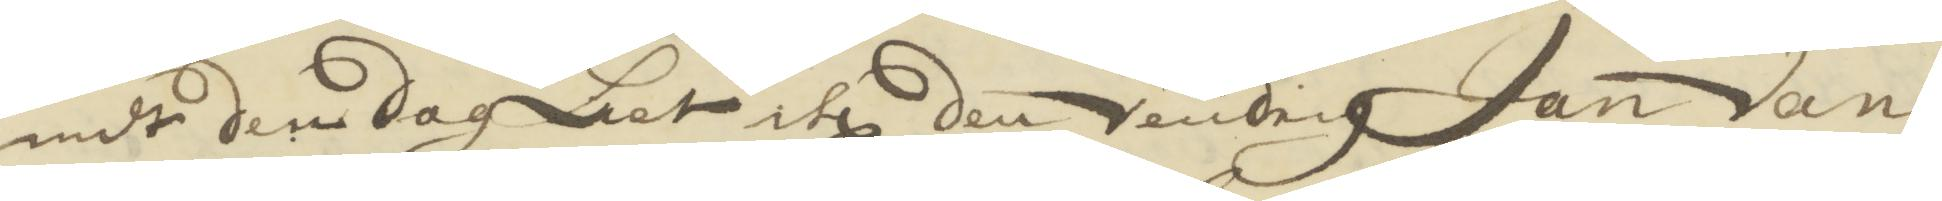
met den dag Liet ik den vendrig Jan van
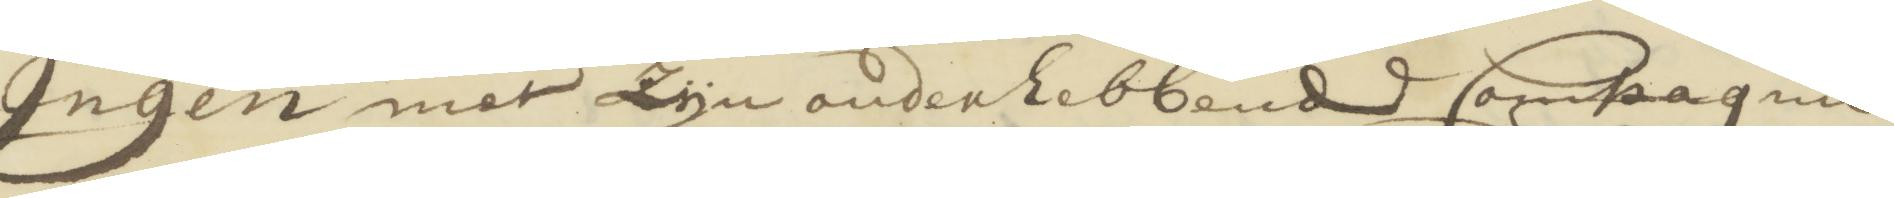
Jngen met zijn onderhebbende Compagnie
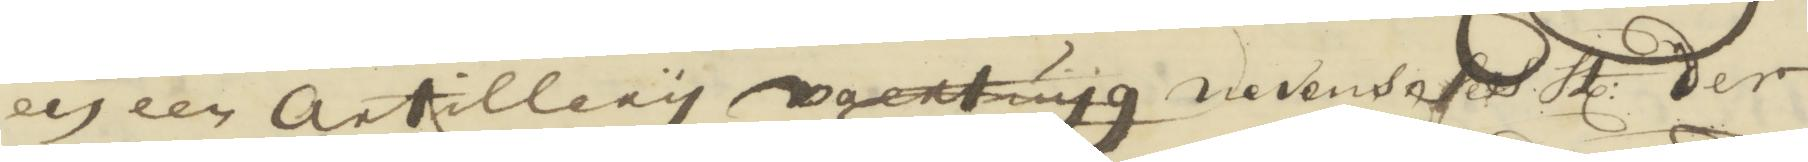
een een artillerij vaertuijg nevens ses st: der
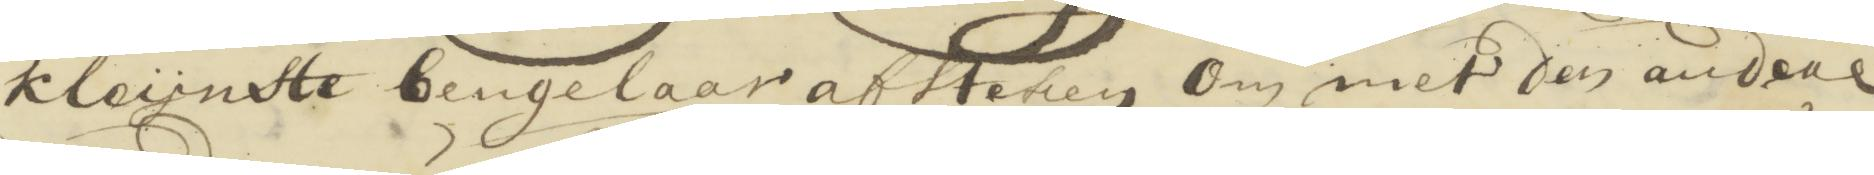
kleijnste bengelaar afsteken om met den anderen
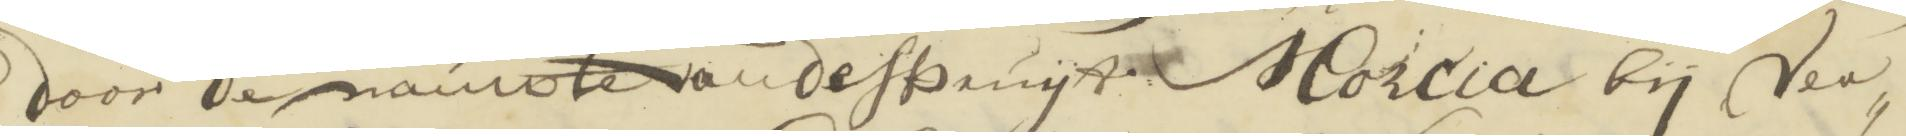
door de nauwte van de spruijt Morcia bij ver„
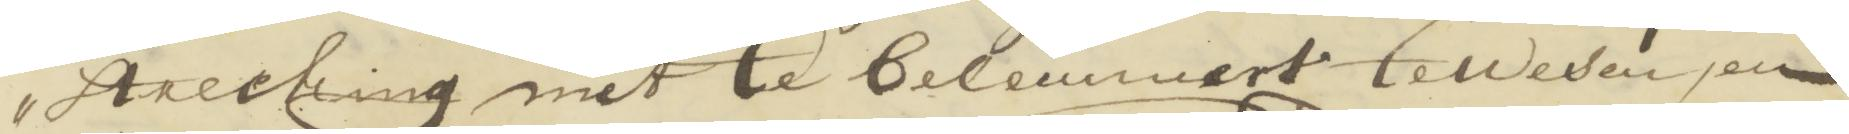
„strecking niet te belemmert te wesen, en
